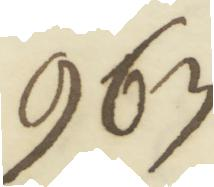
963
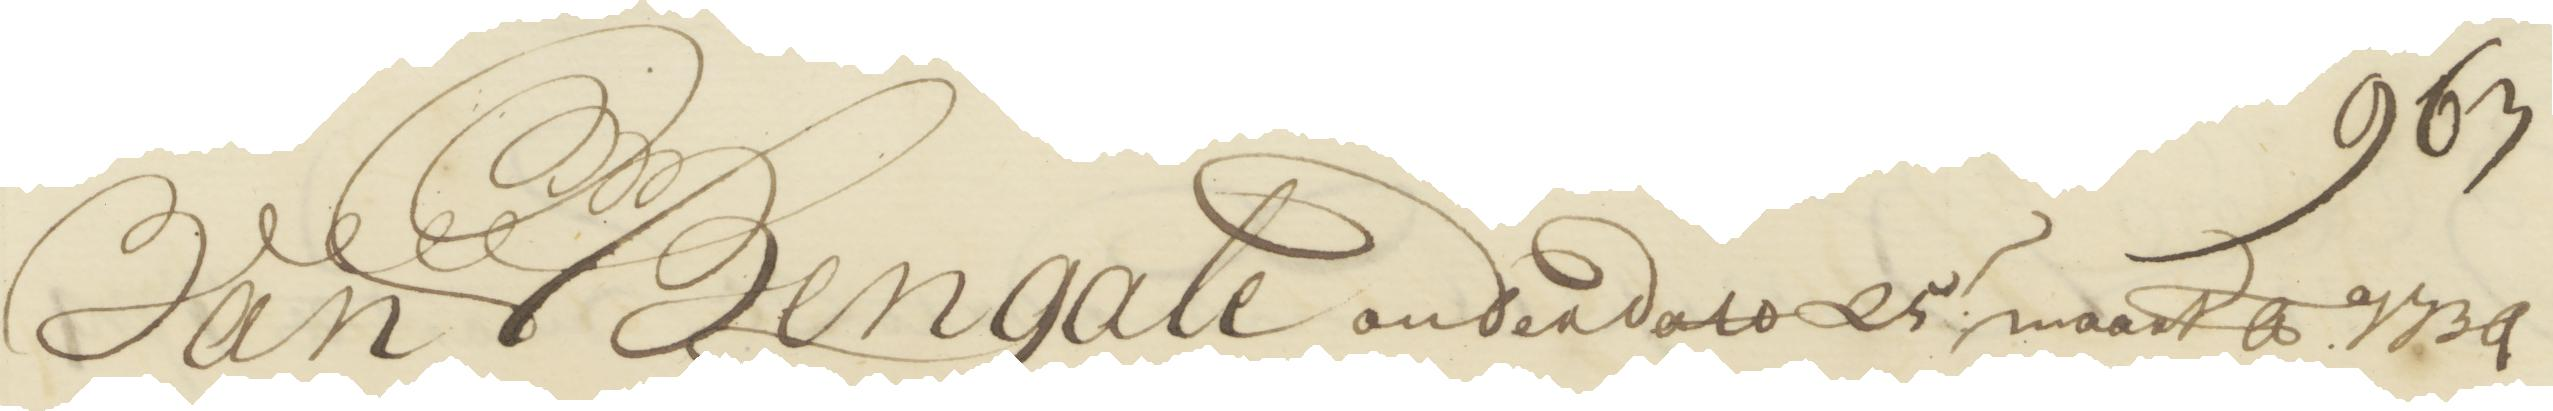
Van Bengale onder dato 25:e maart a„o 1734.
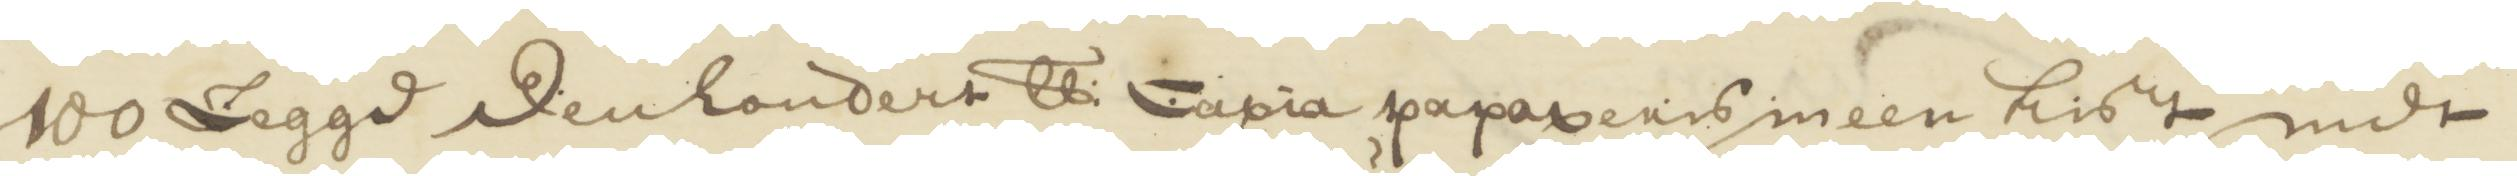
100 zegge Een hondert lb: Capia papaver is in een kist met
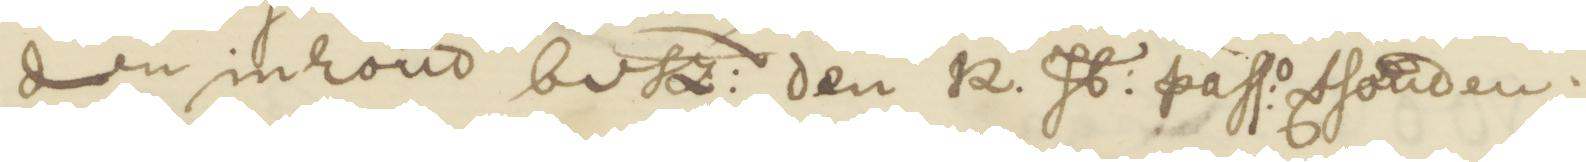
den inhoud besz:' den 12. fb: pass:o versonden.
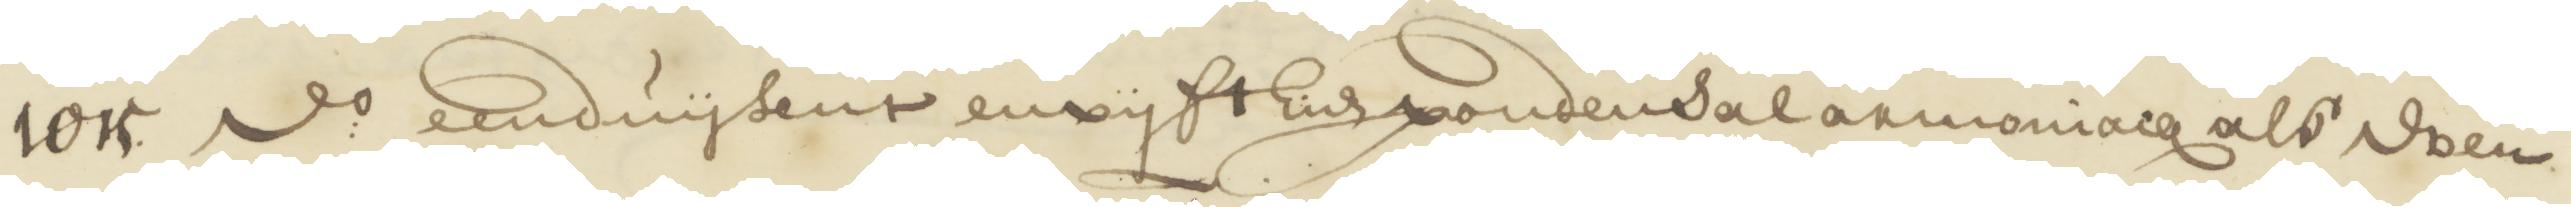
1015. D:o een duijsent en vijfthien ponden salarmoniacq als Even
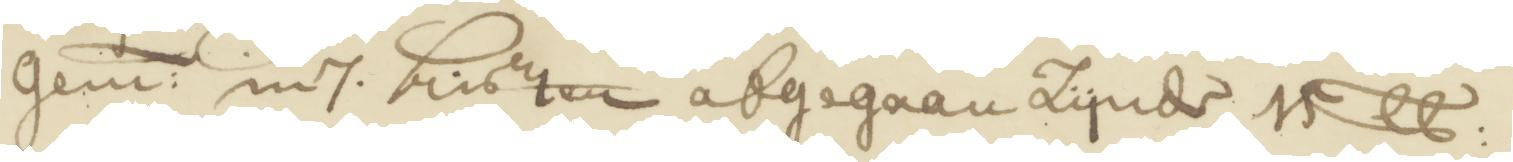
gem: in 7. kisten afgegaan Zijnde 15 lb:
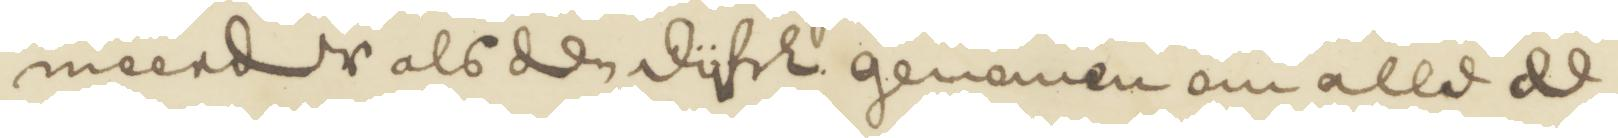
meerder als den Eijsch genomen om alle de
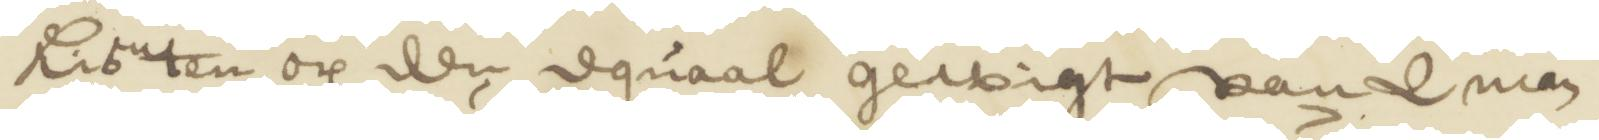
kisten op een equaal gewigt van 2 man
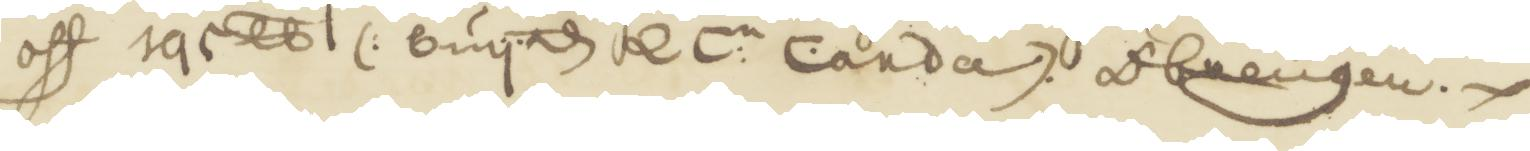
off 145 lb (: buijten 2 C:n Carda te brengen. -
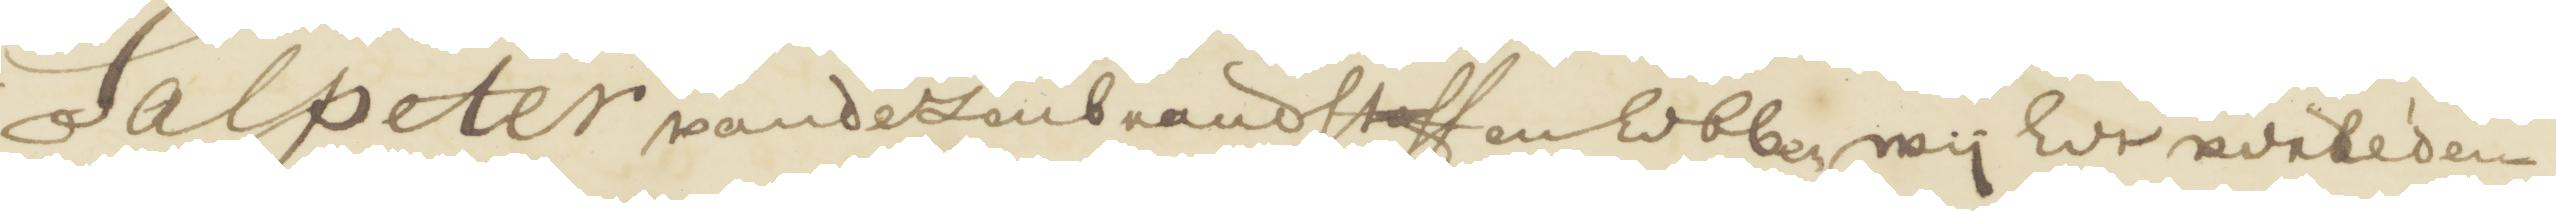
Salpeter van dezen brandstoffen hebben wij het verleden
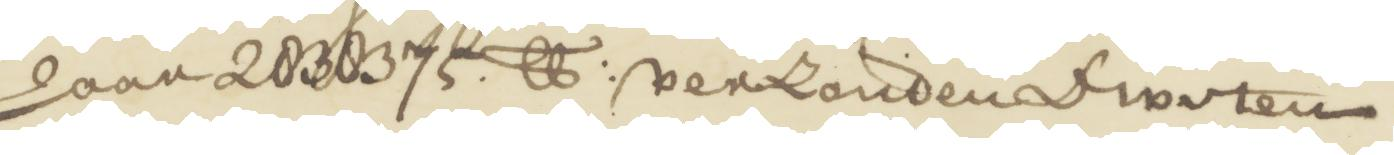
Jaar 2838375. lb: verzonden te weten
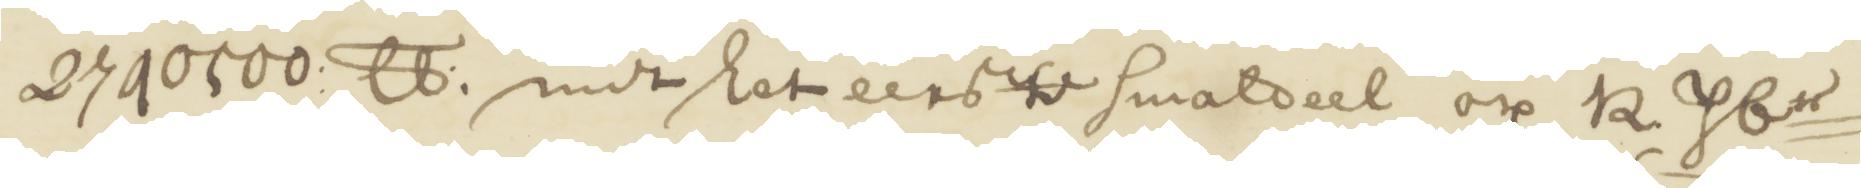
2740500: lb: met het eerste smaldeel op 12. fb=is
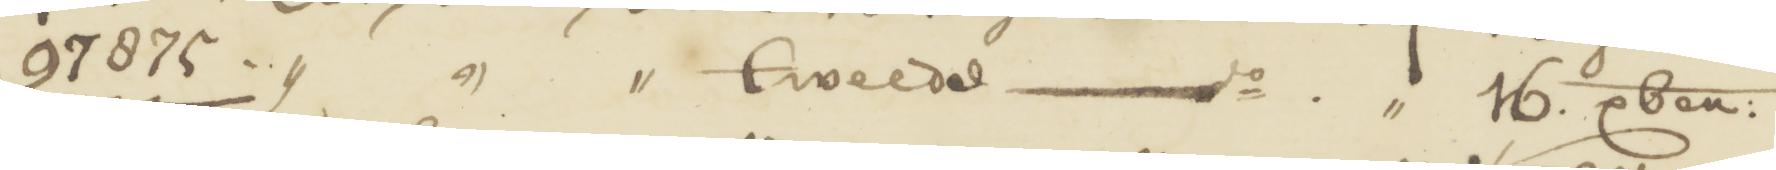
97875.. „ „ tweede d=o . „ 16. xber:
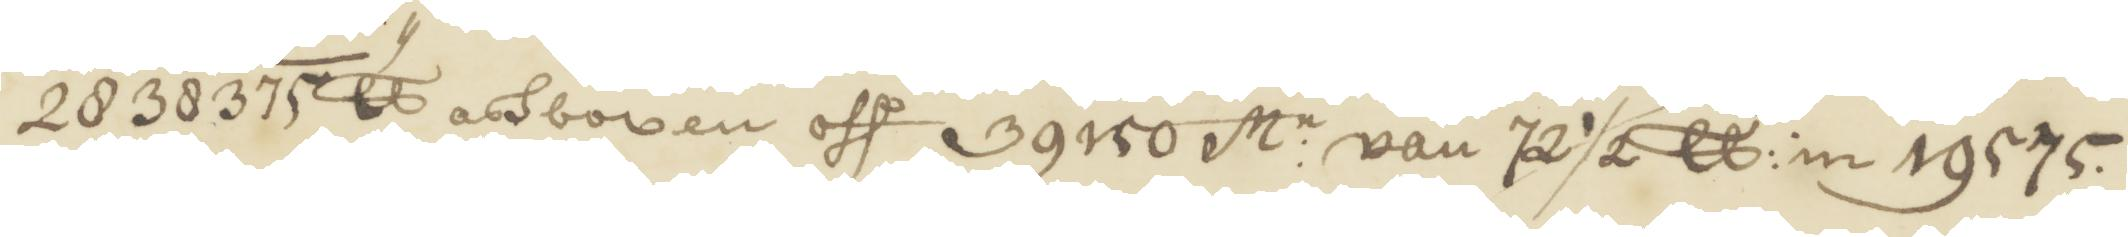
2838375 lb als boven off 39150 M:n van 72½ lb: in 19575.
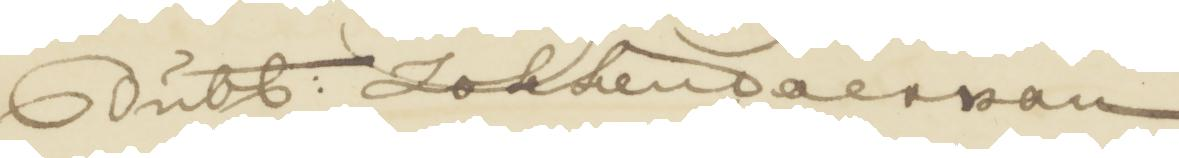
dubb: zakken daer van
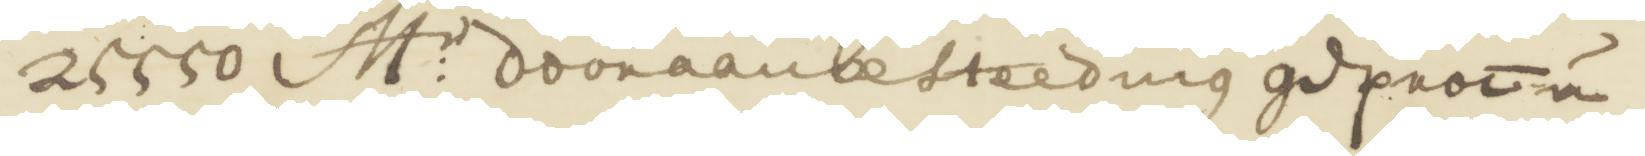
25550 M:n door aanbesteeding geprocu
